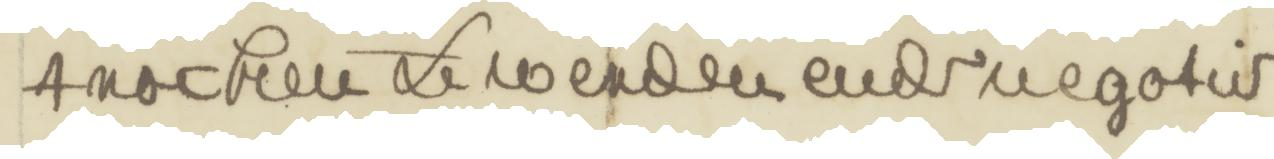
trocken te werden ende negotie
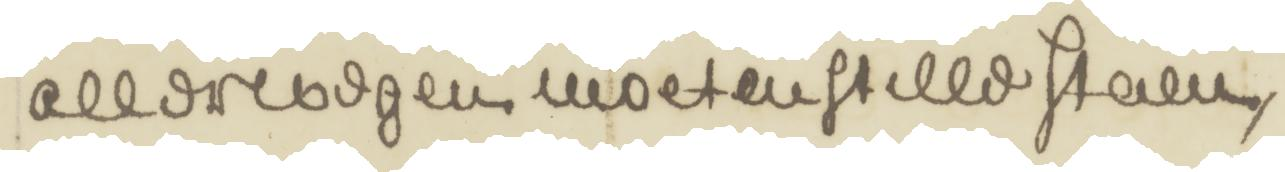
allerwegen moeten stille staen,
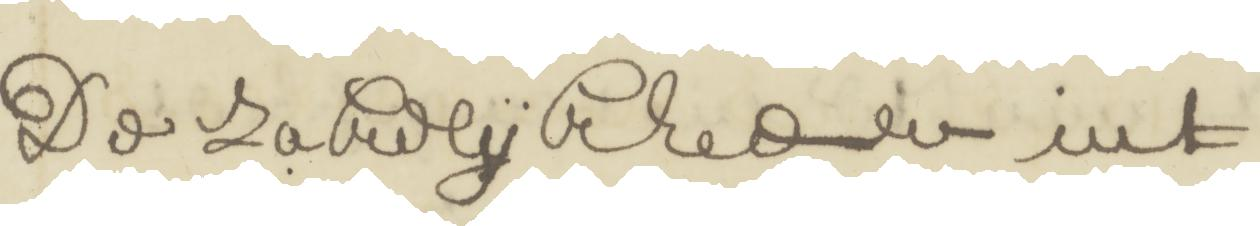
De zakelijkheden int
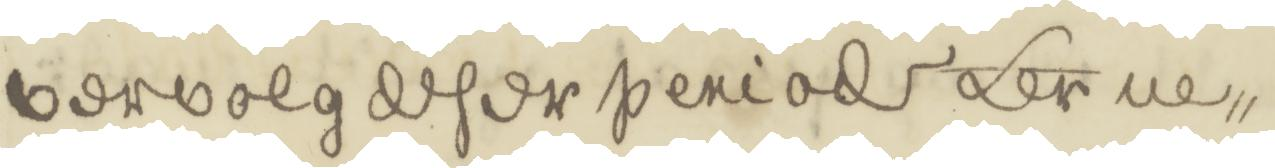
vervolg deser periode ter ne„
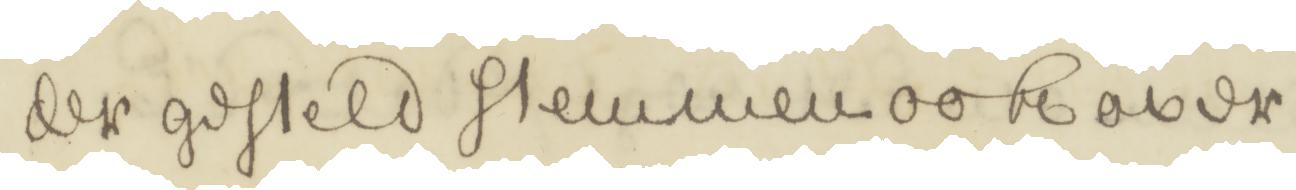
der gesteld stemmen ook over
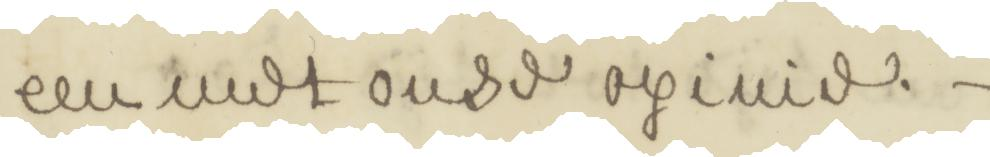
een met onse opinie.
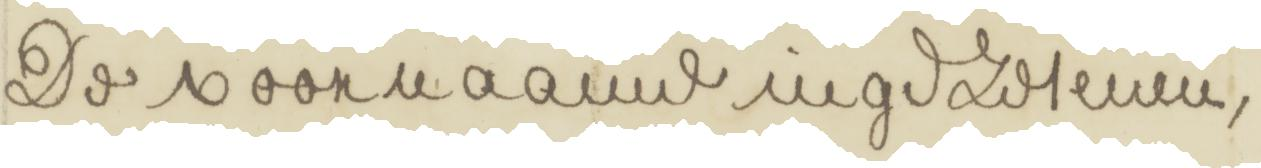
De voornaame ingezetenen,
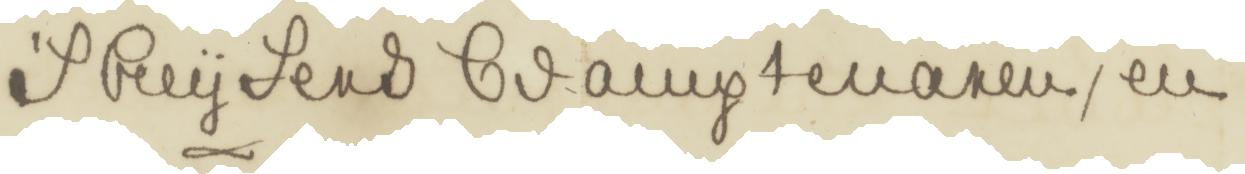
's keijsers beamptenaren, en
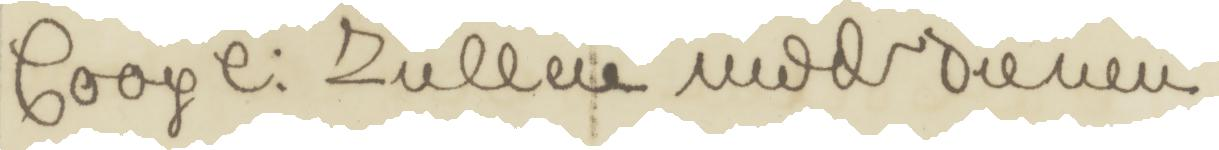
Coopl: zullen mede dienen
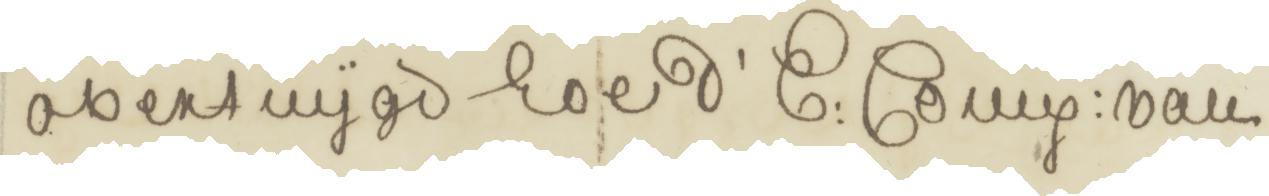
overtuijgd hoe d'E: Comp: van
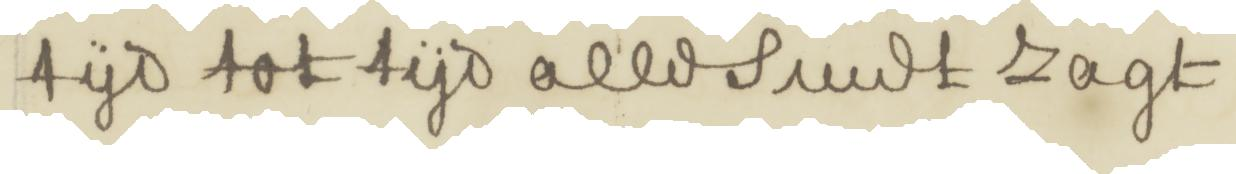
tijd tot tijd alle met zagt
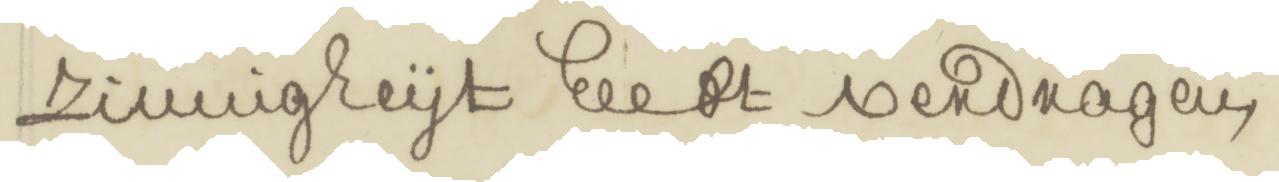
zinnigheijt heeft verdragen,
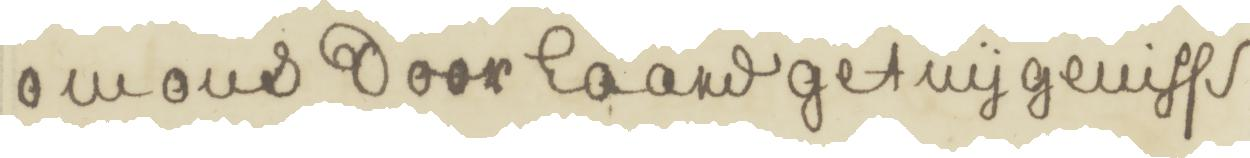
om ons door haare getuijgenisse
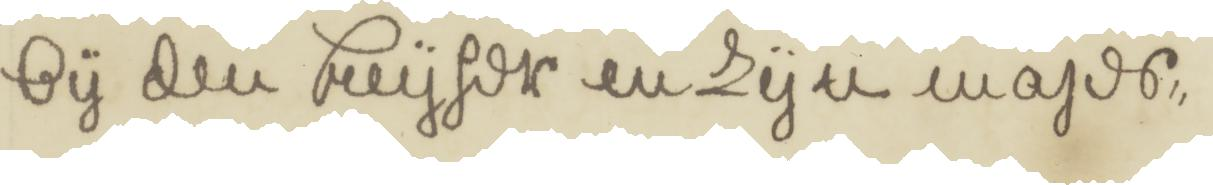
bij den keijser en zijn majes„
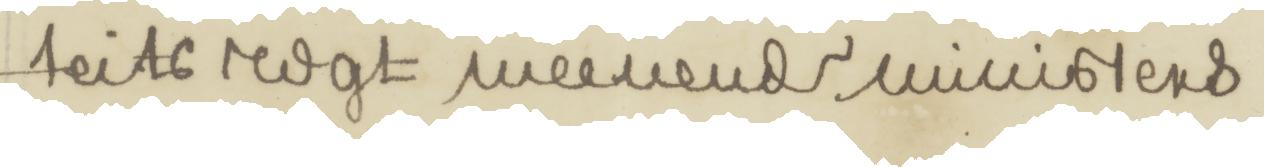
teits regt meenende ministers
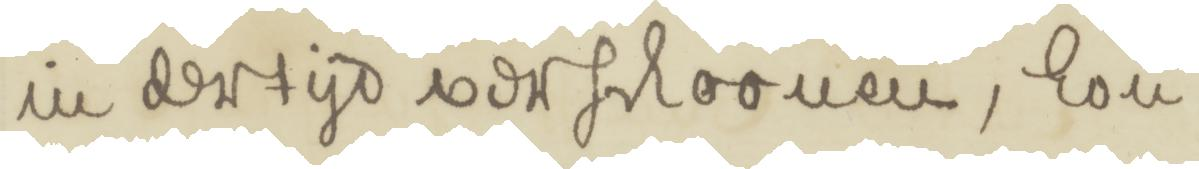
in der tijd verschoonen, hou
